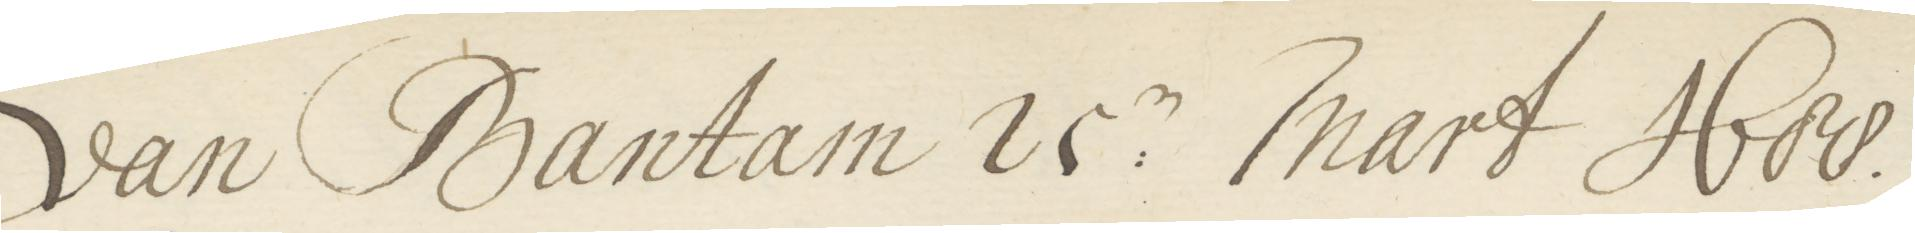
Van Bantam 25:n Mart 1688.
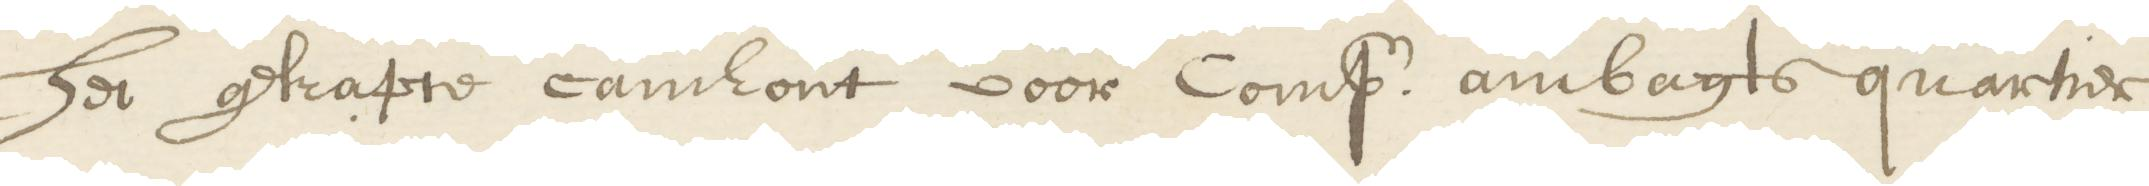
het gekapte camhout voor Comp: ambagtsquartier
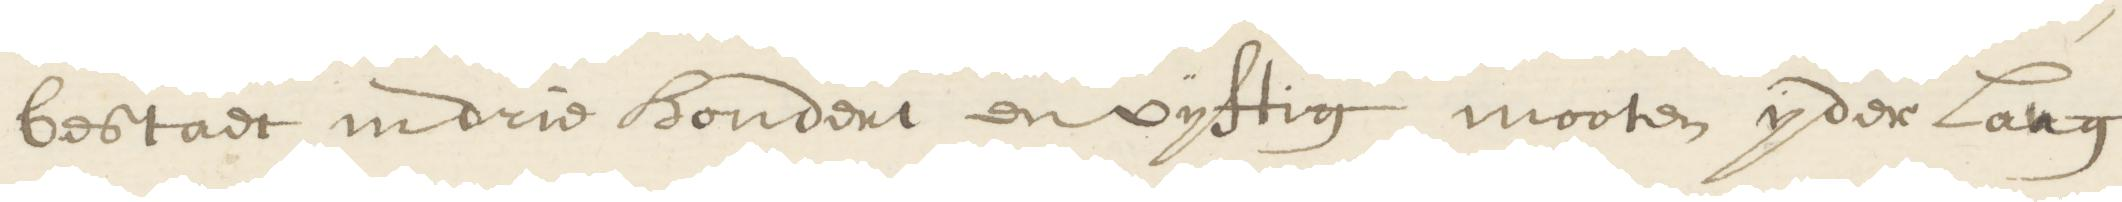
bestaet in drie hondert en vijftig mooten ijder lang
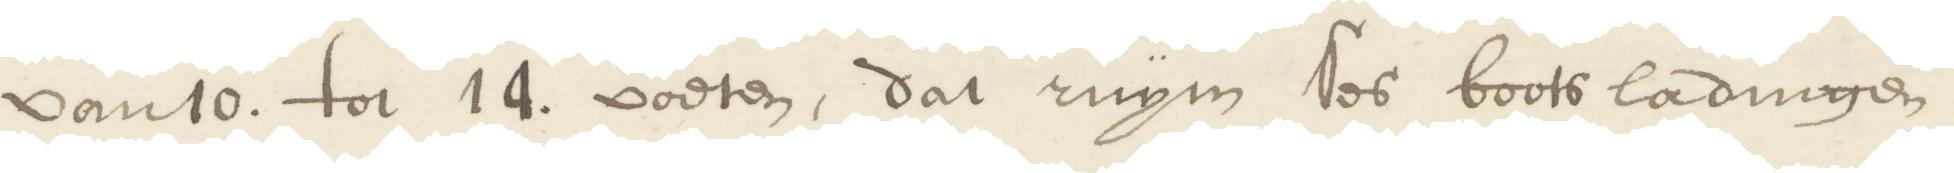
van 10. tot 14. voeten, dat ruijm ses boots ladingen
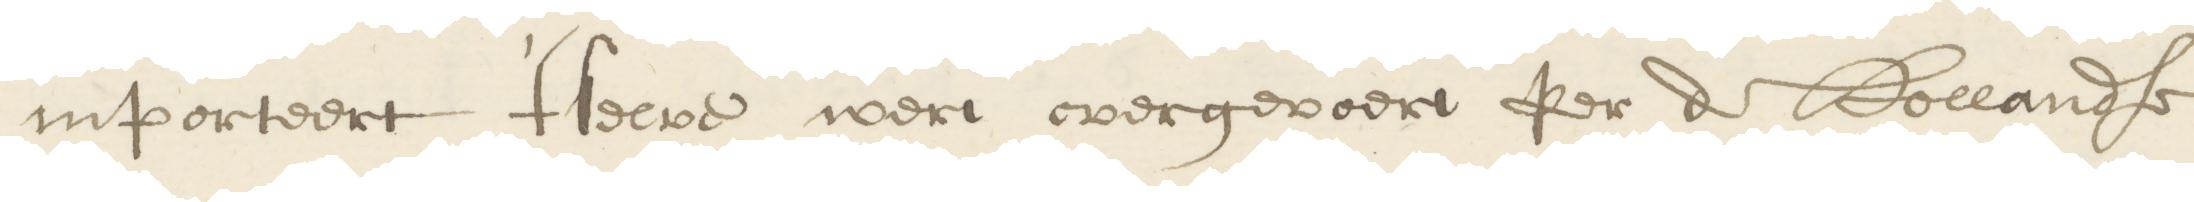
inporteert 't selve wert overgevoert per de Hollandse
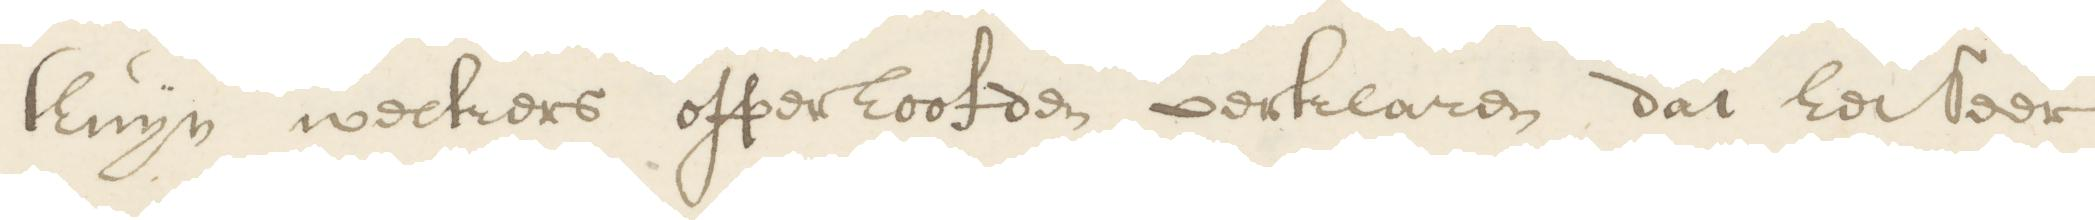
thuijn welkers opperhoofden verklaren dat het seer
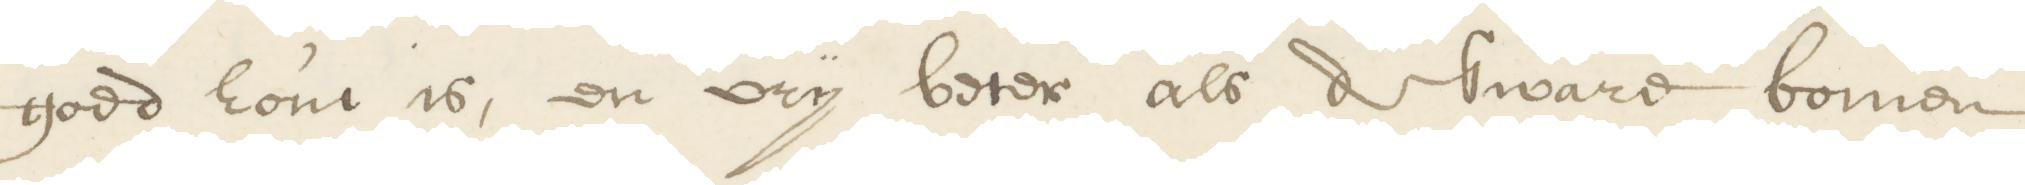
goed hout is, en vrij beter als de sware bomen,
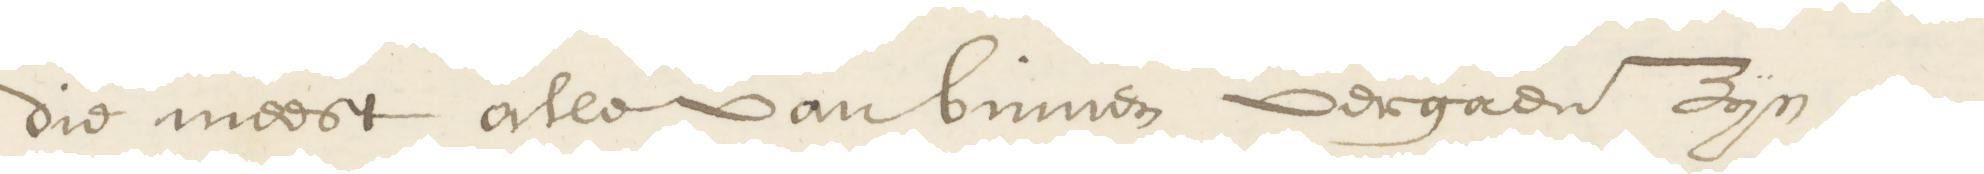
die meest alle van binnen vergaen zijn
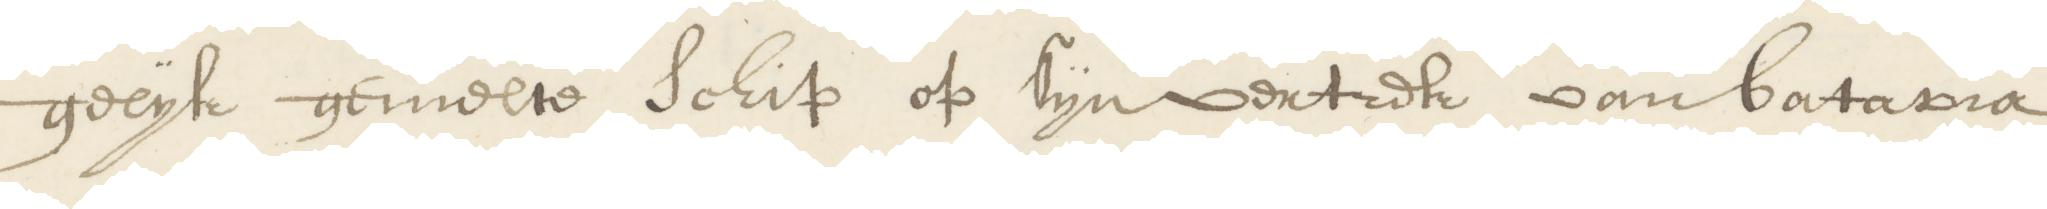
gelijk gemelte schip op sijn vertrek van batavia
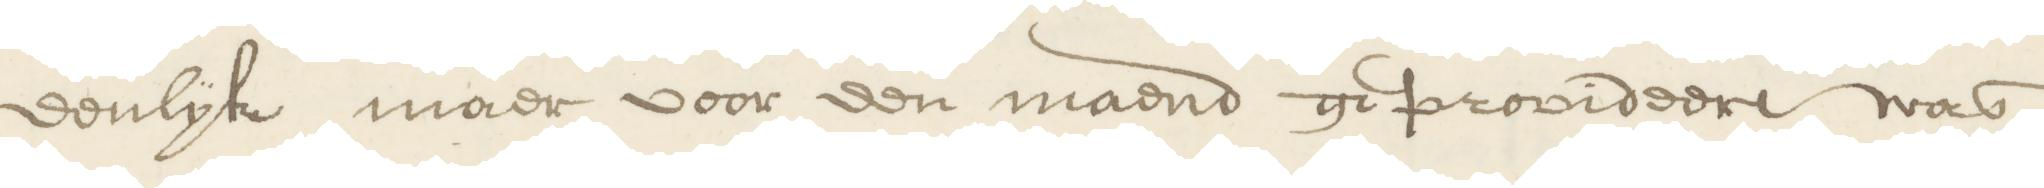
eenlijk maer voor een maend geprovideert was
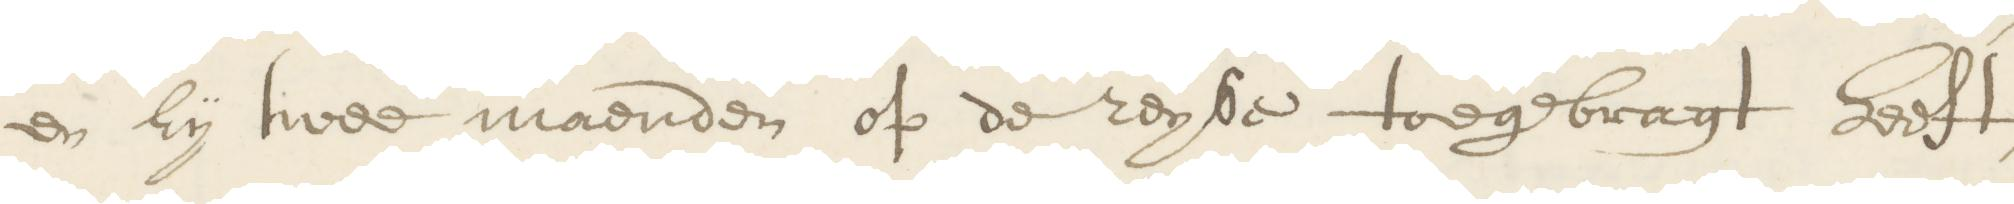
en hij twee maenden op de reijse toegebragt heeft,
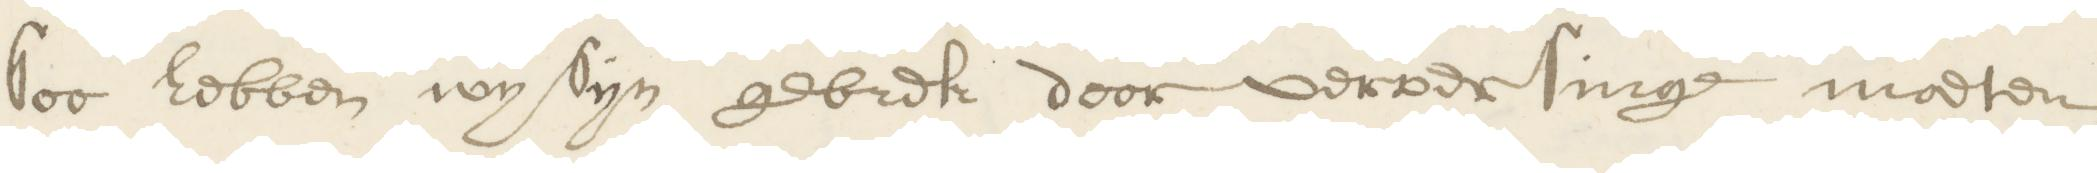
soo hebben wij sijn gebrek door verversinge moeten
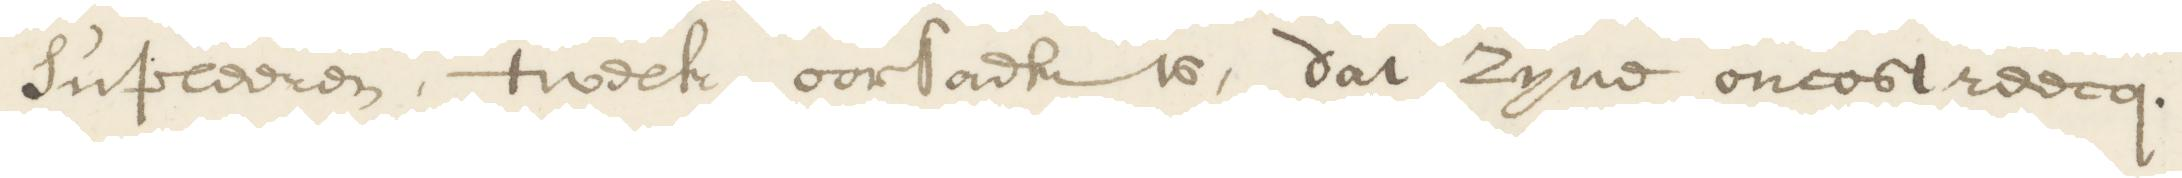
supleeren, twelk oorsaek is, dat zijne oncost reecq.
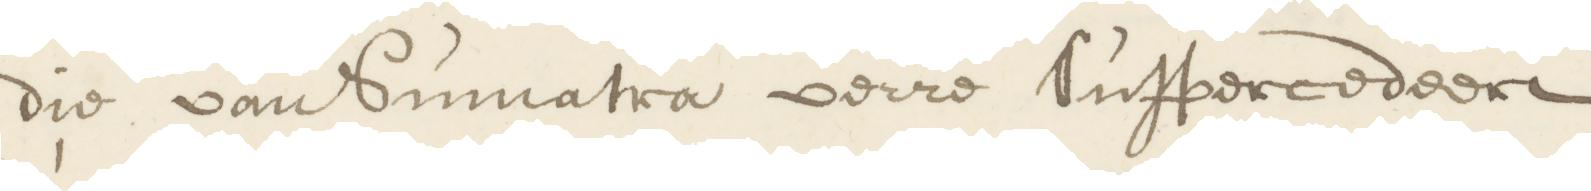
die van Sumatra verre suppercedeert
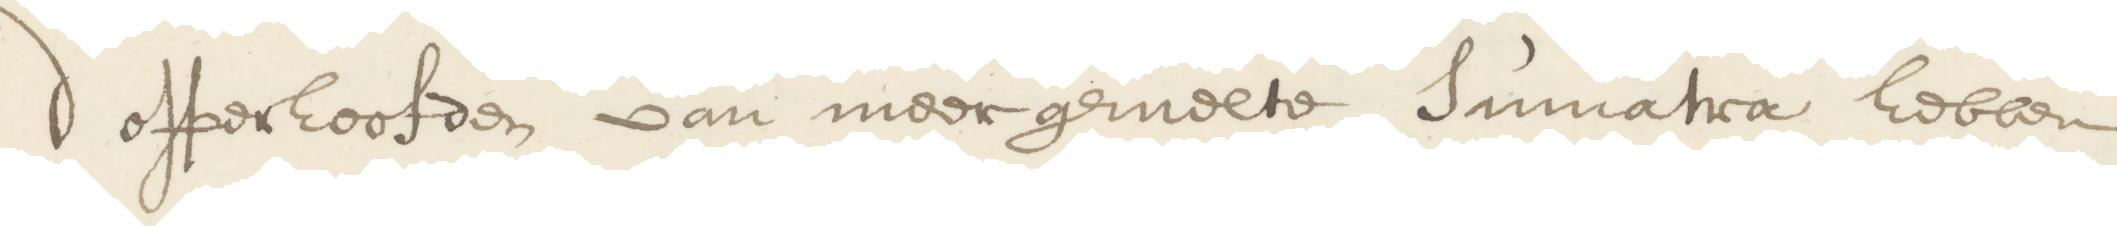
d opperhoofden van meer gemelte Sumatra hebben
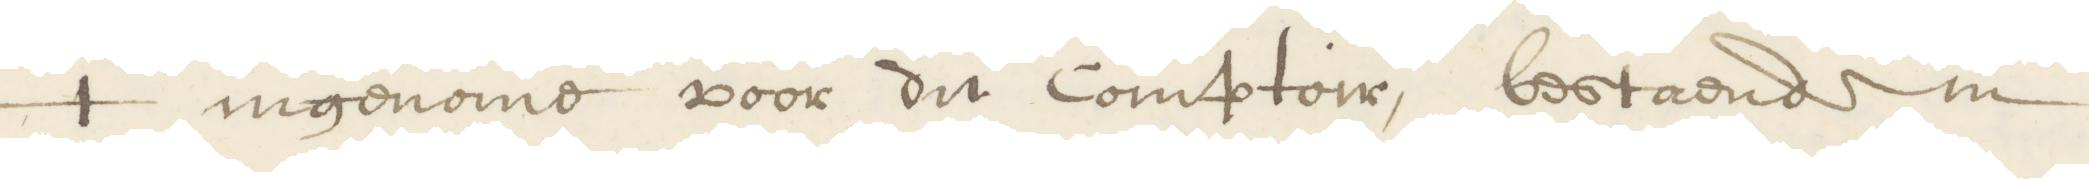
t ingenome voor dit Comptoir, bestaende in
